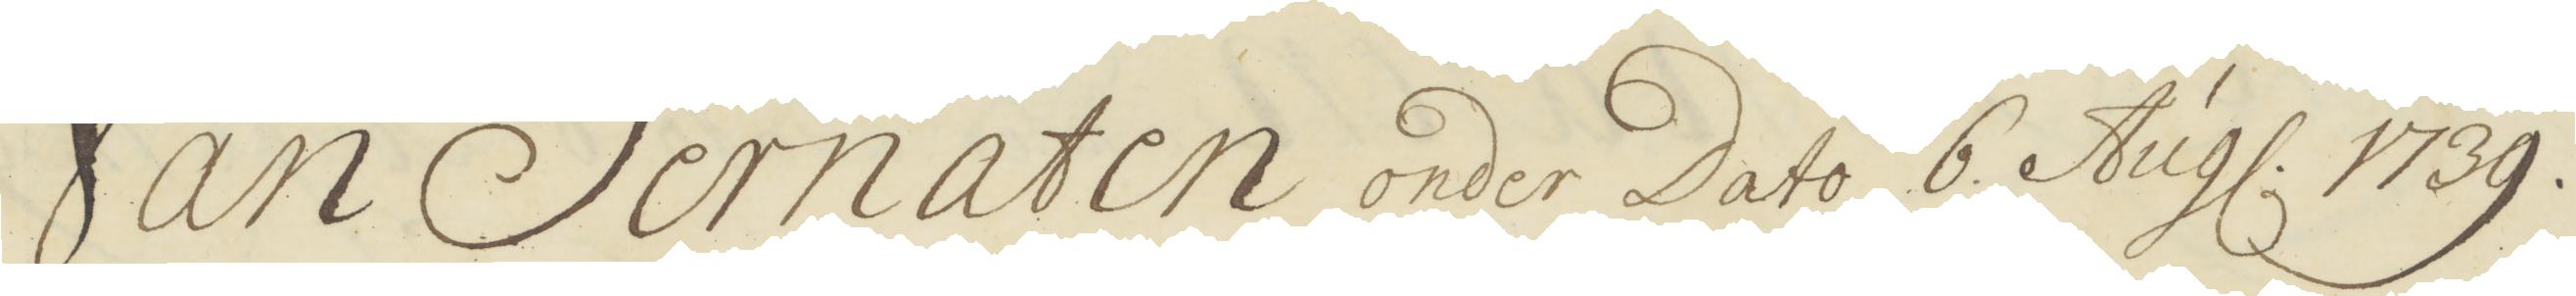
Van Ternaten onder Dato 6. AugC: 1739.
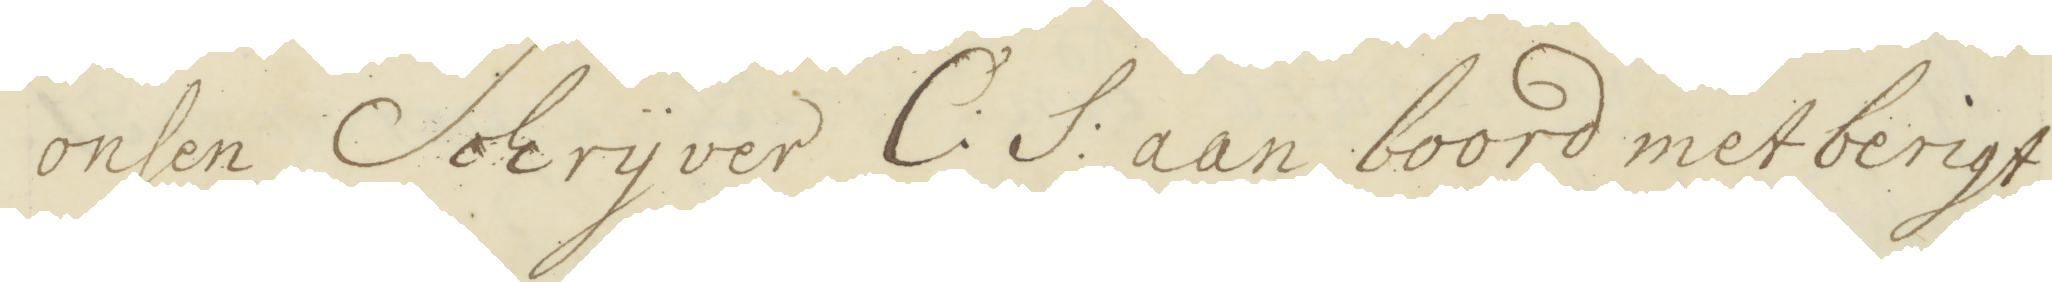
onsen Schrijver C: S: aan boord met berigt
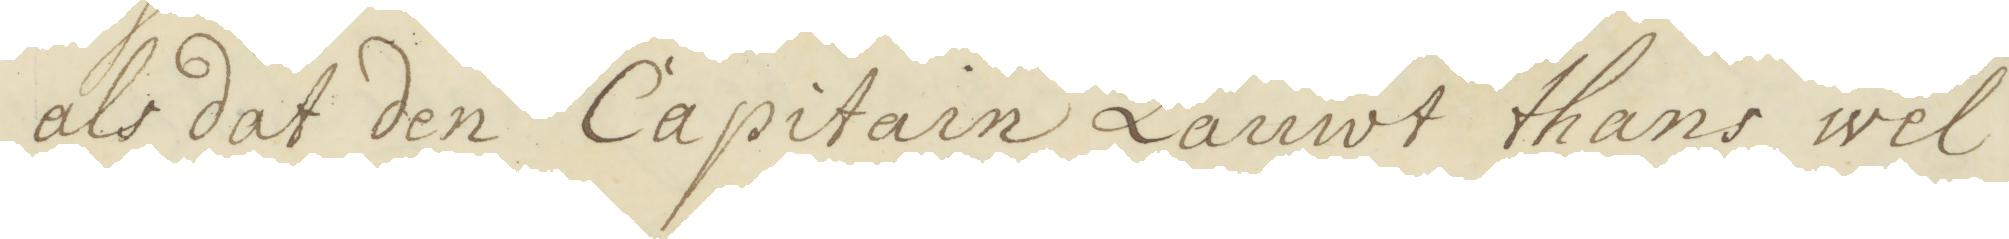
als dat den Capitain Lauwt thans wel
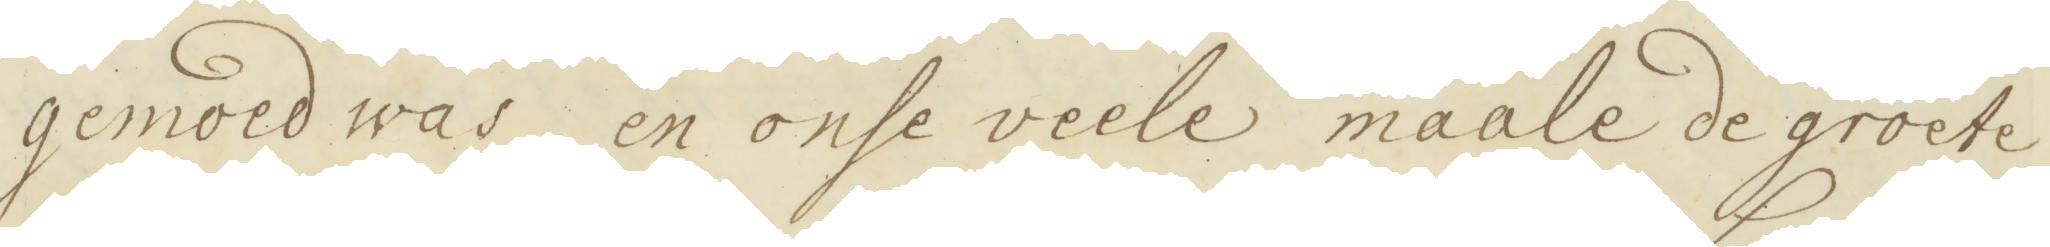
gemoed was, en onse veele maale de groete
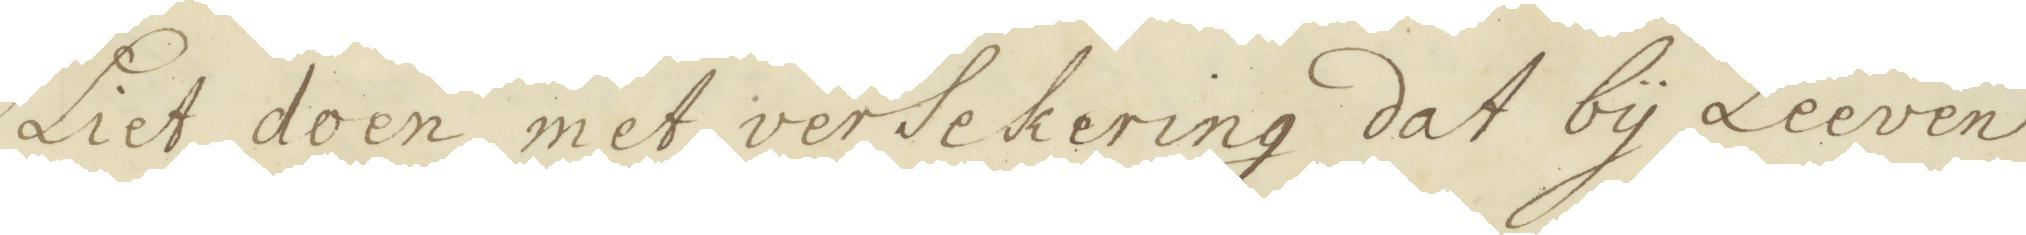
Liet doen met versekering dat bij Leeven
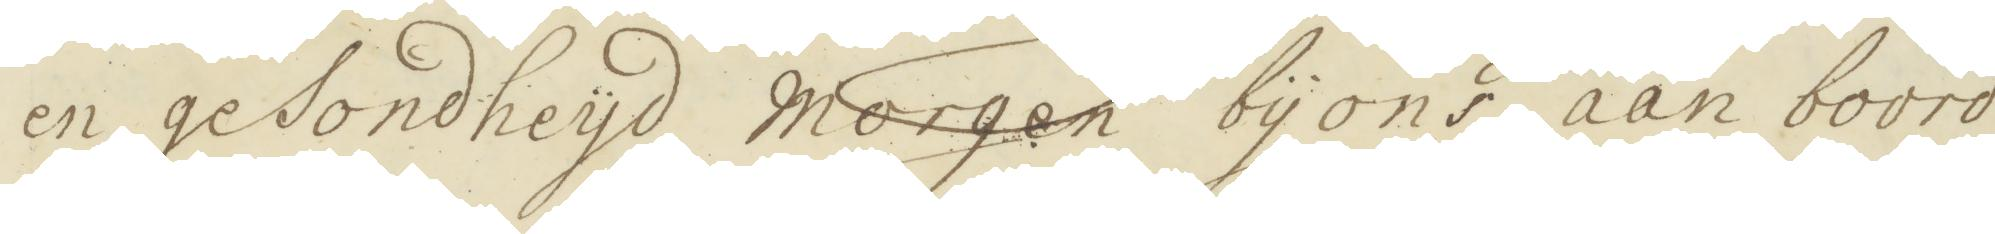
en gesondheijd morgen bij ons aan boord
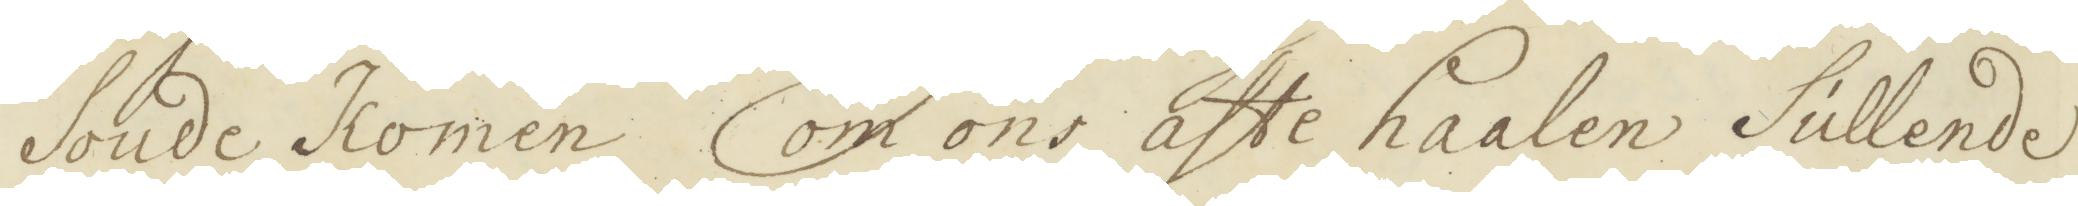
soude komen om ons afte haalen sullende
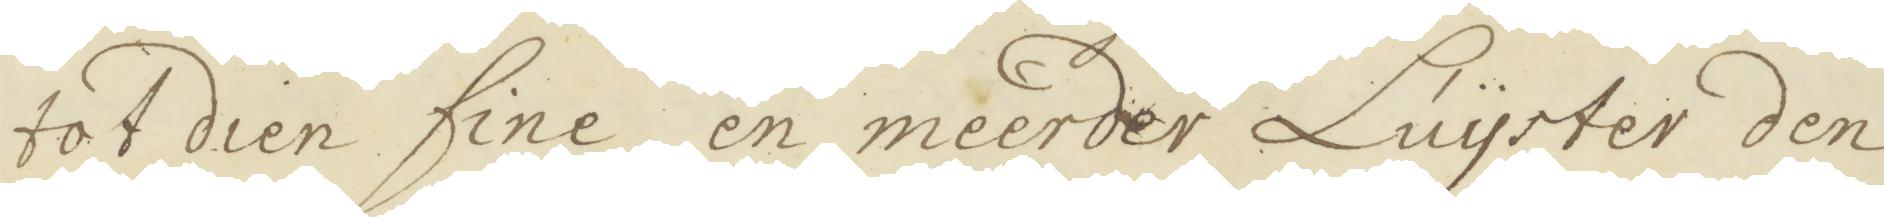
tot dien fine, en meerder Luijster den
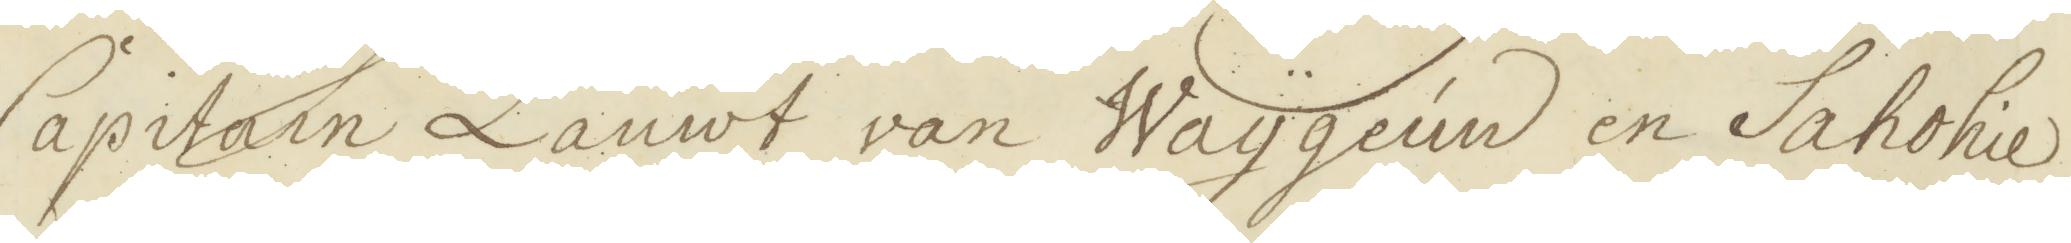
Capitain Lauwt van Waijgeun en Sahohie
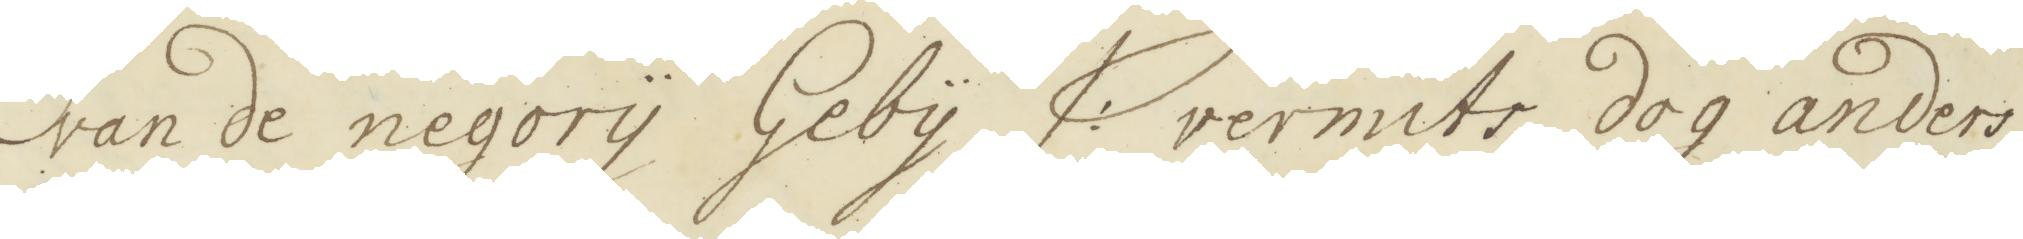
van de negorij Gebij /: vermits dog anders
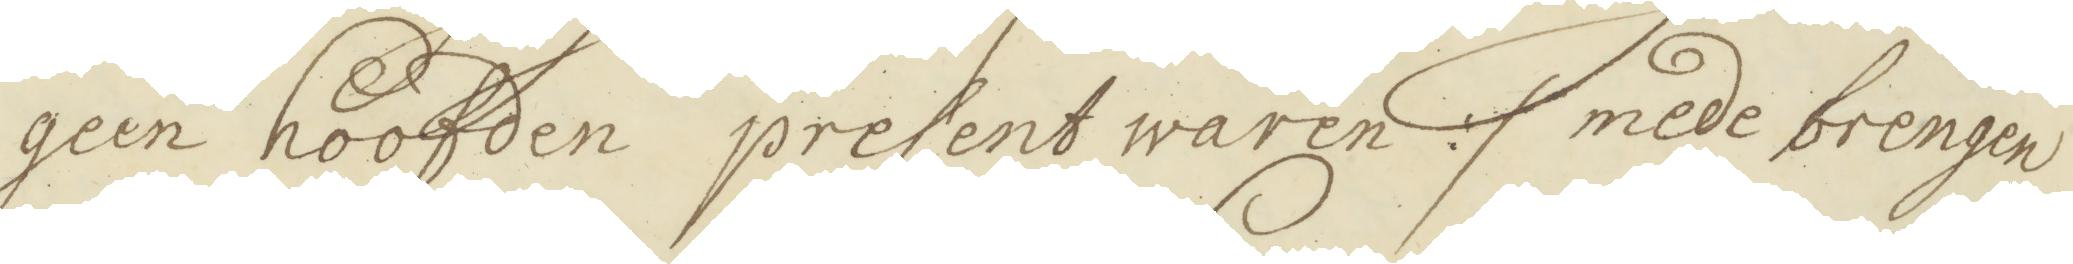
geen hoofden present waren :/ mede brengen
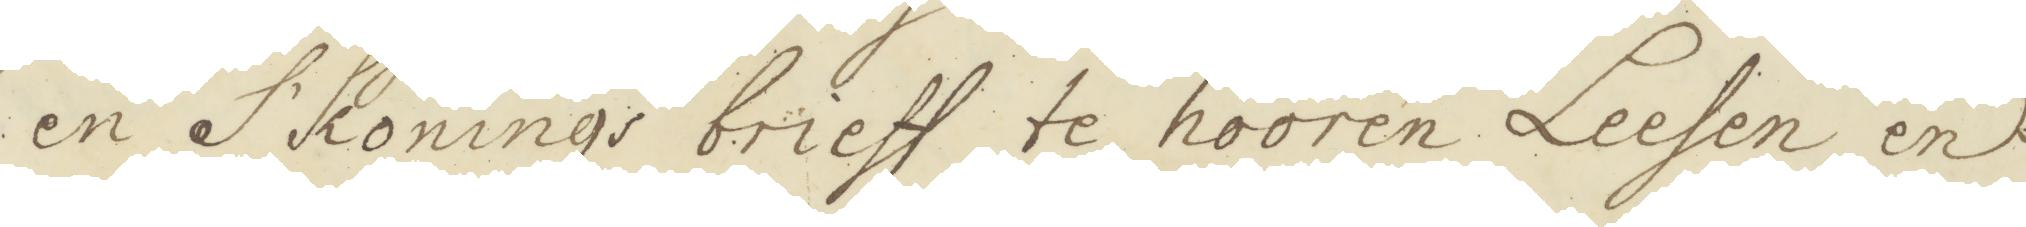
en s'konings brieff te hooren Leesen en
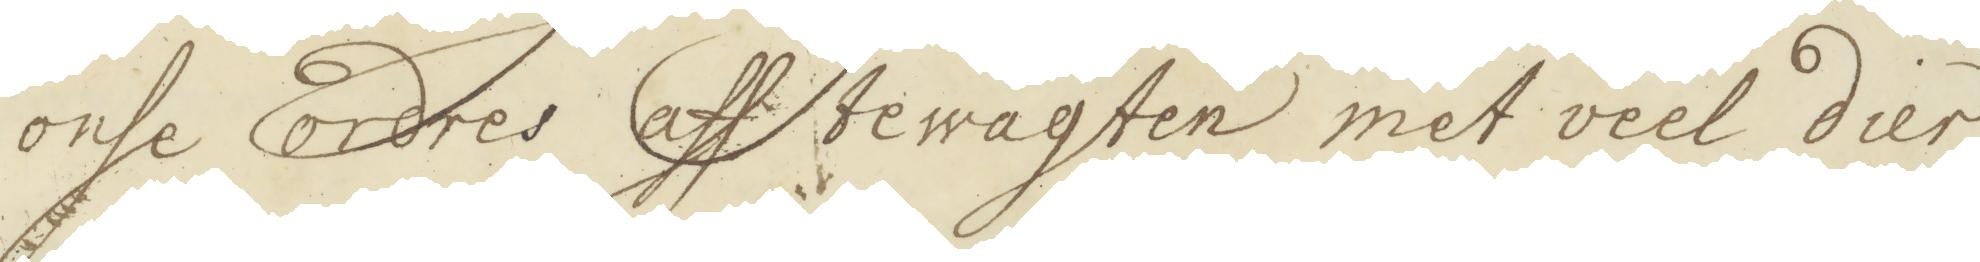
onse ordres aff tewagten met veel dier
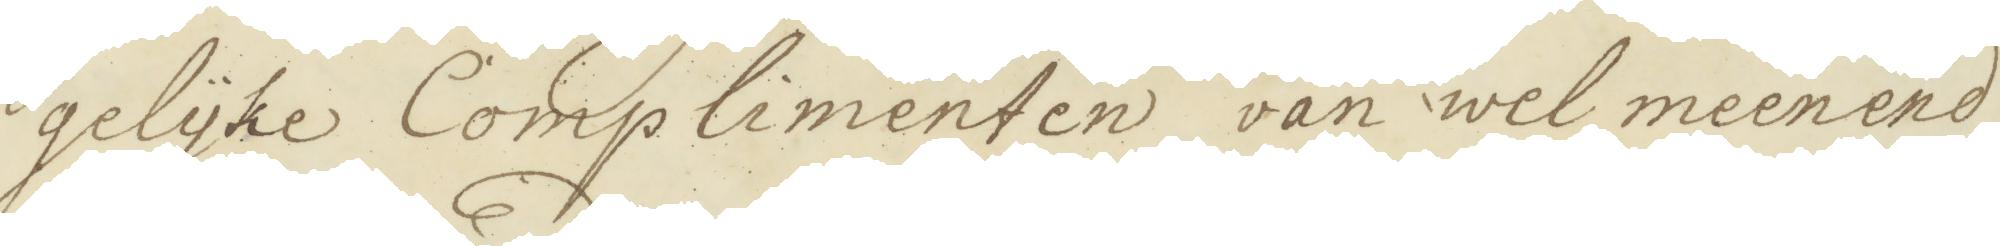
gelijke Complimenten van wel meenend
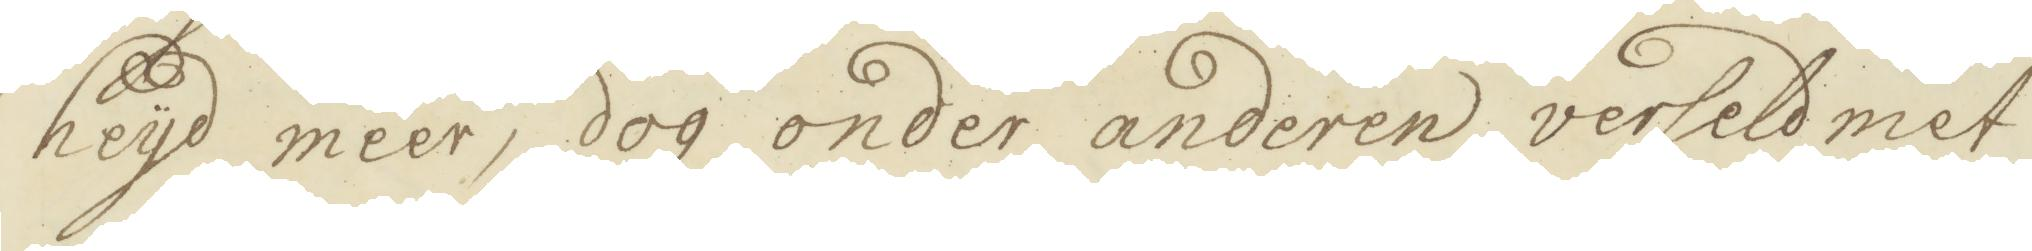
heijd meer, dog onder anderen verseld met
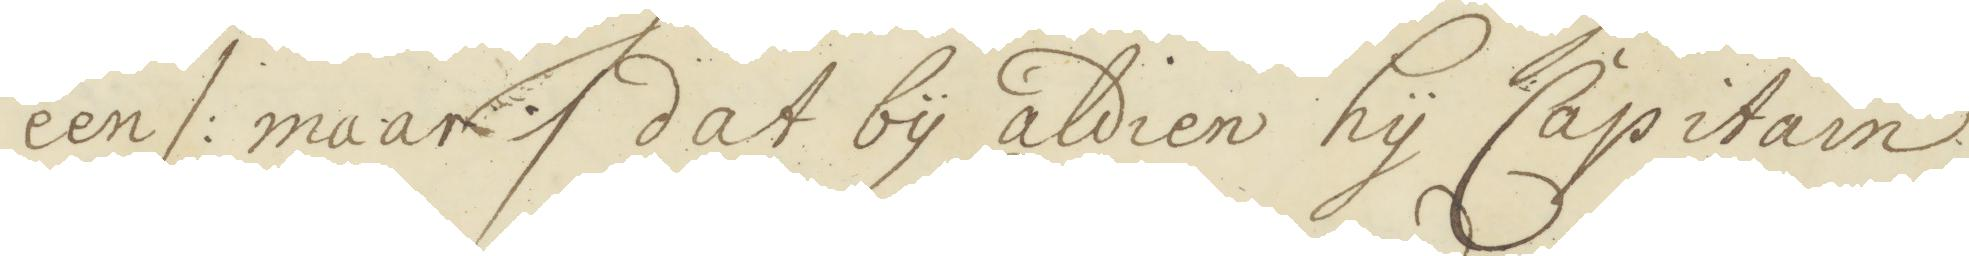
een /: maar / dat bij aldien hij Capitain
